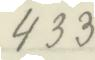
433
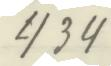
434
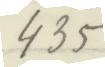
435
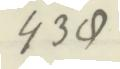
438
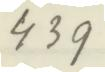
439
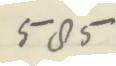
585
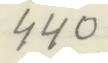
440
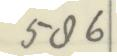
586
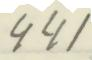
441
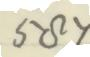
587
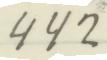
442
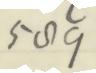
589
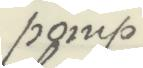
pomp
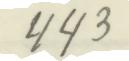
443
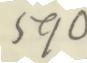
590
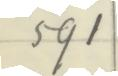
591
